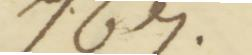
767.
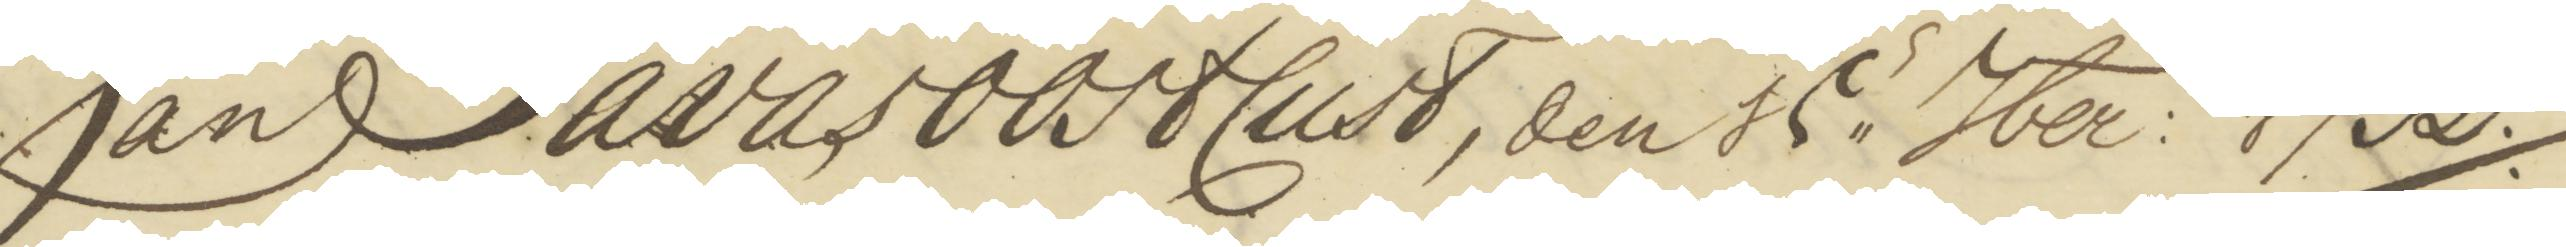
Van Iava,soostCust, den 15„' 7ber: 1732:
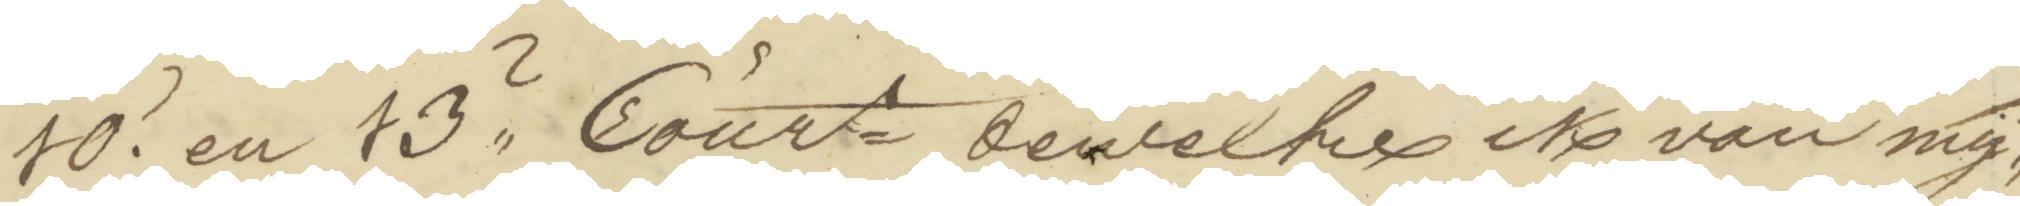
10.' en 13„' Cour=t dewelke ik van mij
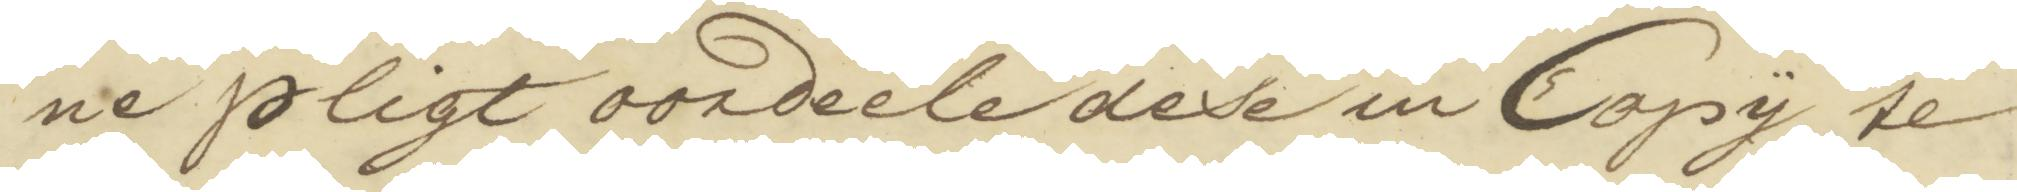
ne pligt oordeele dese in Copij te
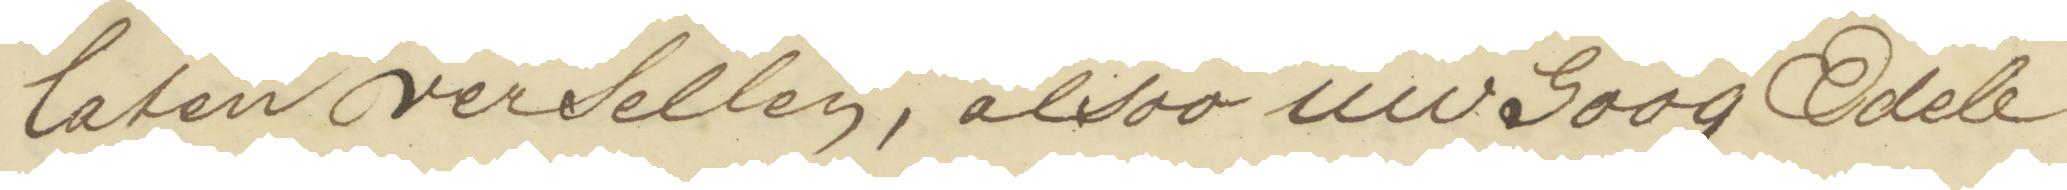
laten versellen, alsoo uw hoog Edele
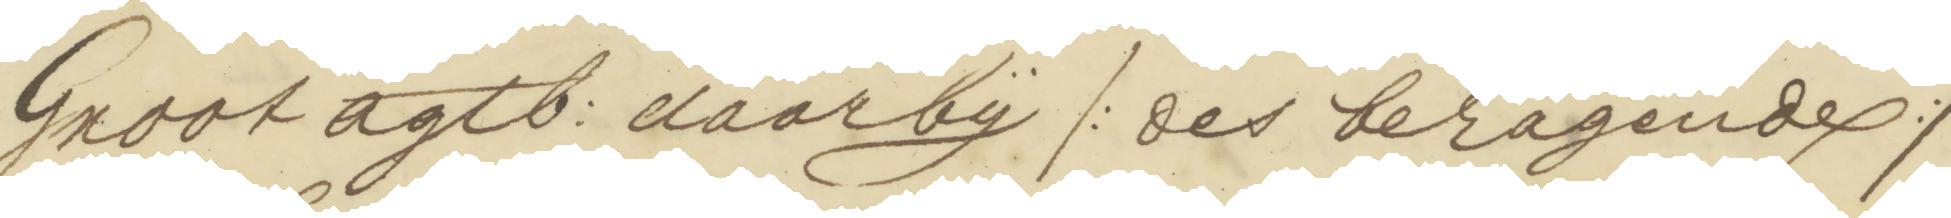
Groot agtb: daarbij /:des behagende:/
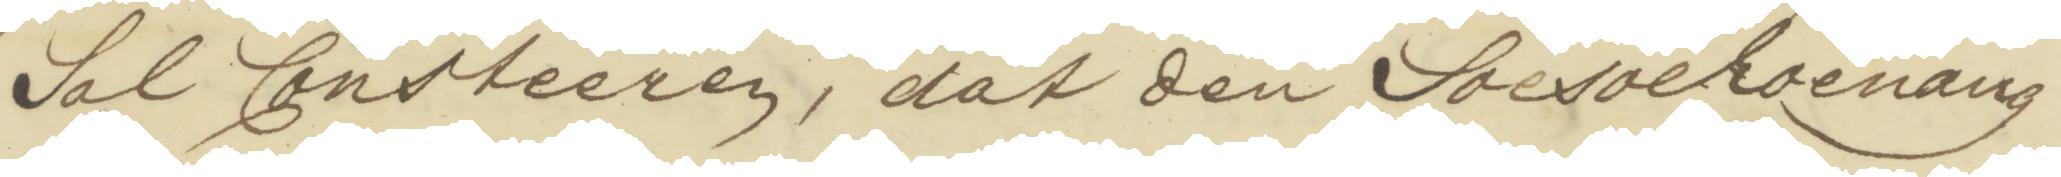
sal Consteeren, dat den soesoehoenang
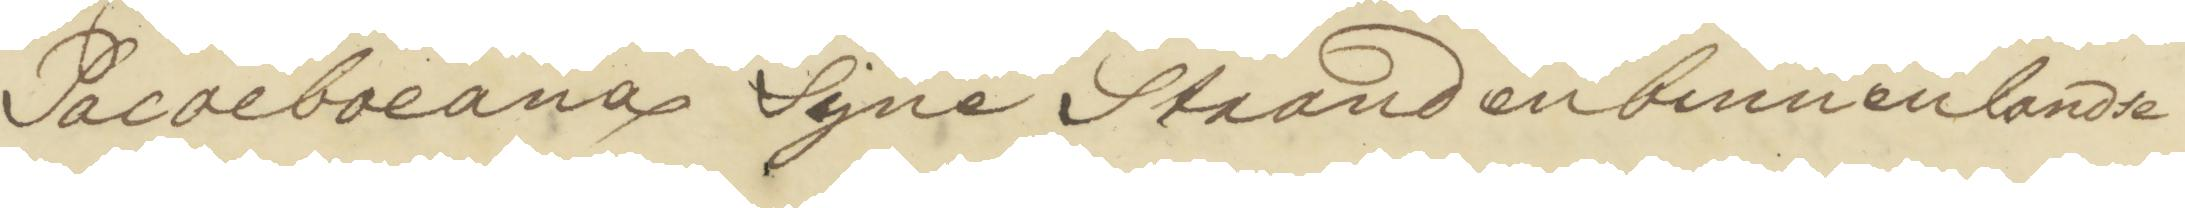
Pacoeboeana sijne strand en binnenlandse
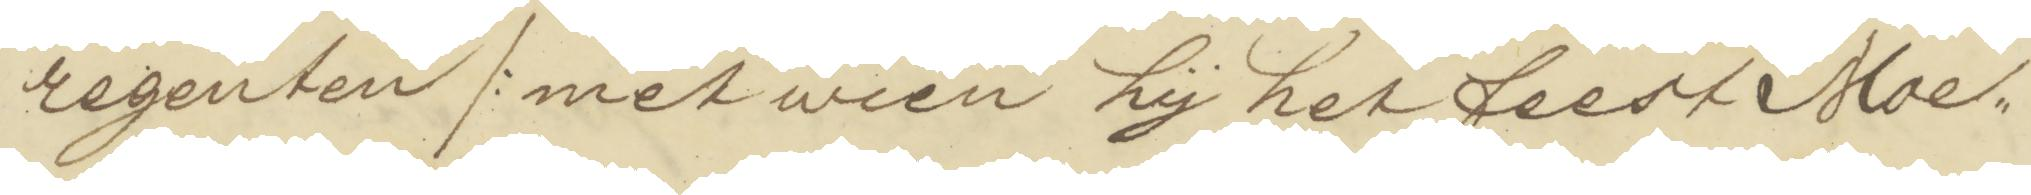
regenten /:met wien hij het feest Moe„
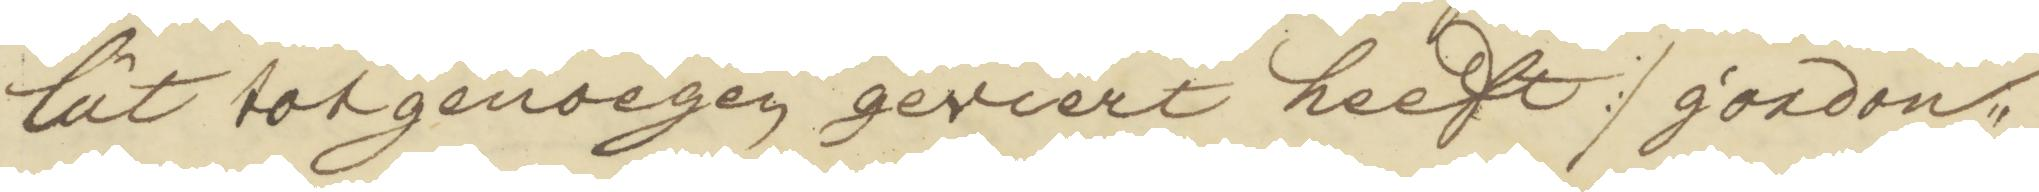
lut tot genoegen geviert heeft:/ g'ordon„
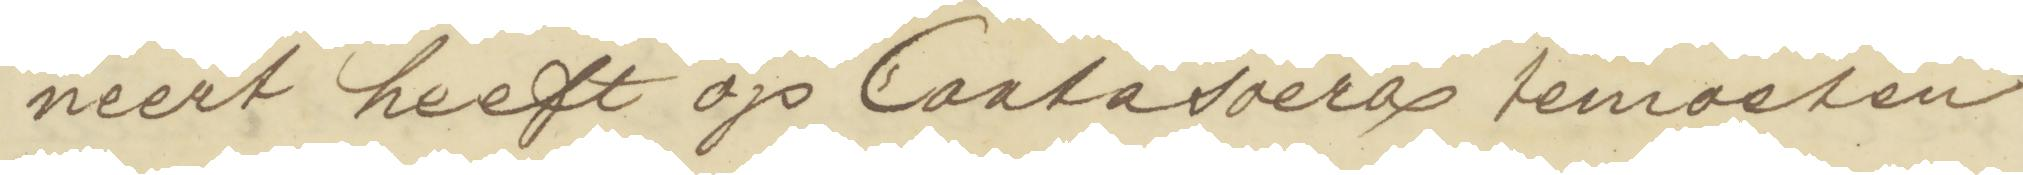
neert heeft op Cartasoera temoeten
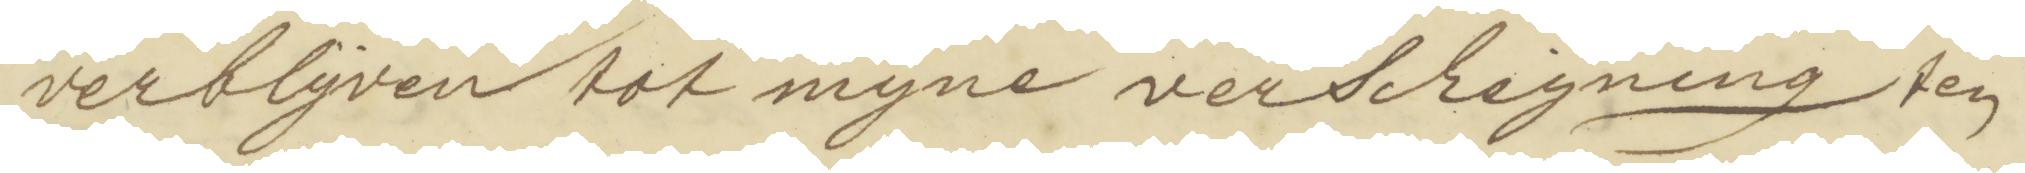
verblijven tot mijne verscheijning ten
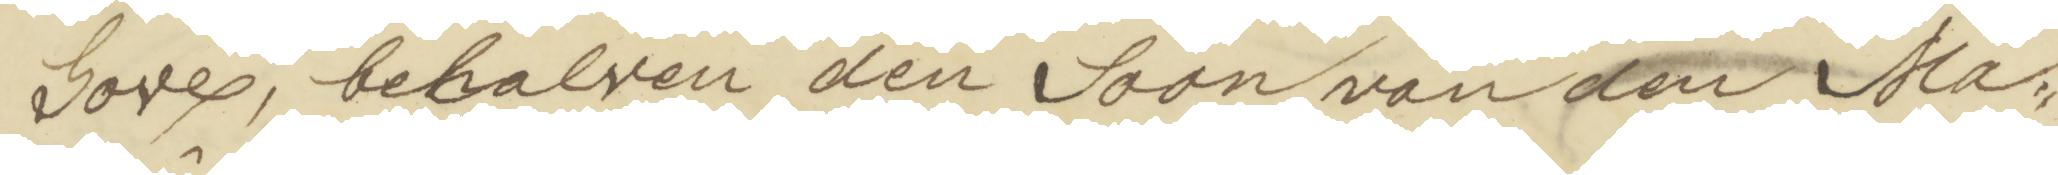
hove, behalven den soon van den Ma
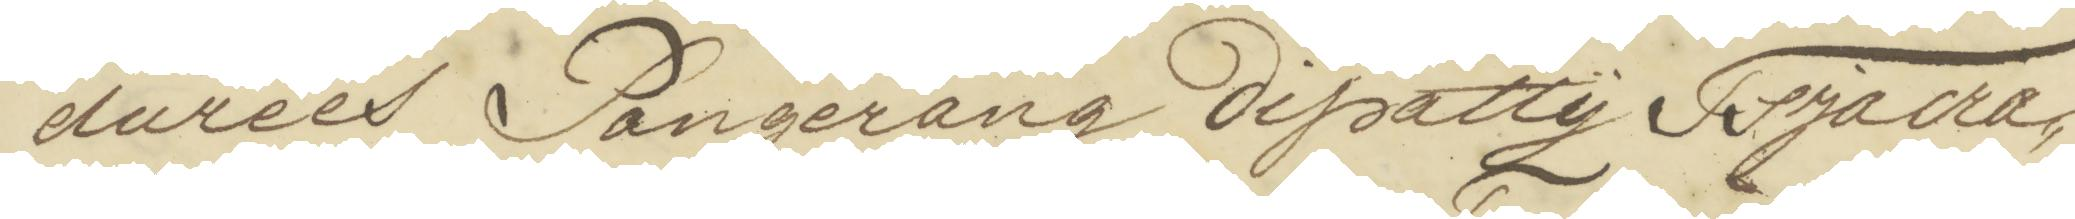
durees Pangerang dipattij Tsjacra„
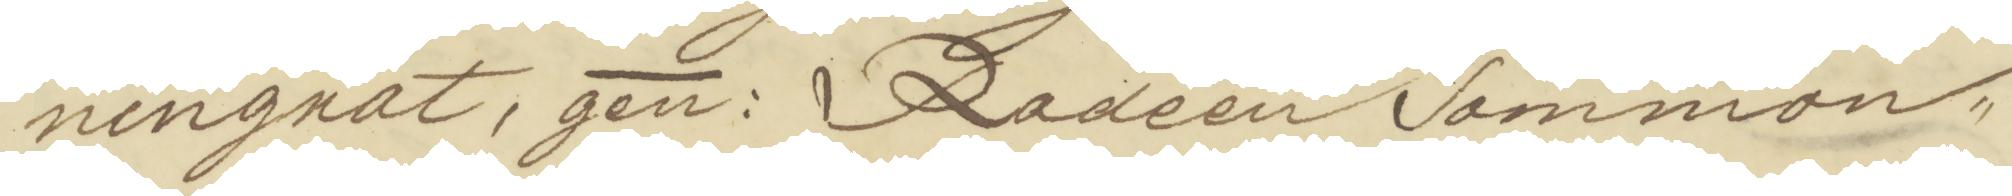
ningrat, gen: Radeen Tommon„
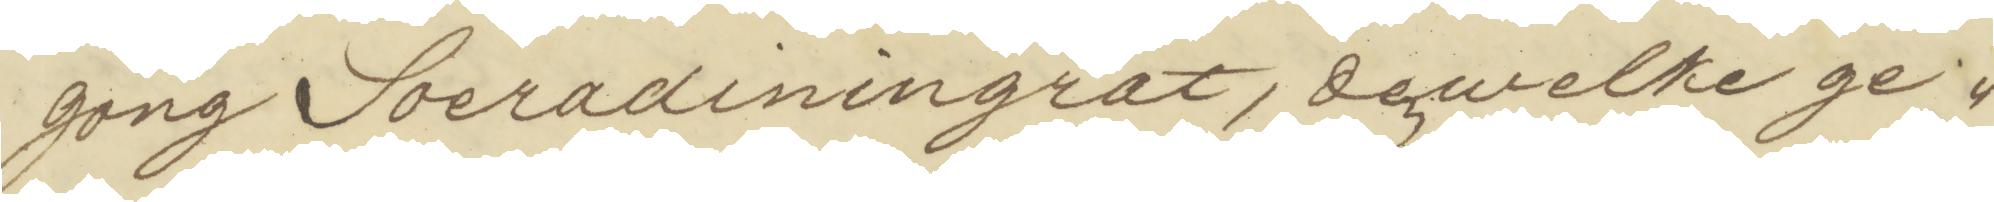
gong Soeradiningrat, dewelke ge
